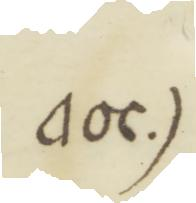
405.)
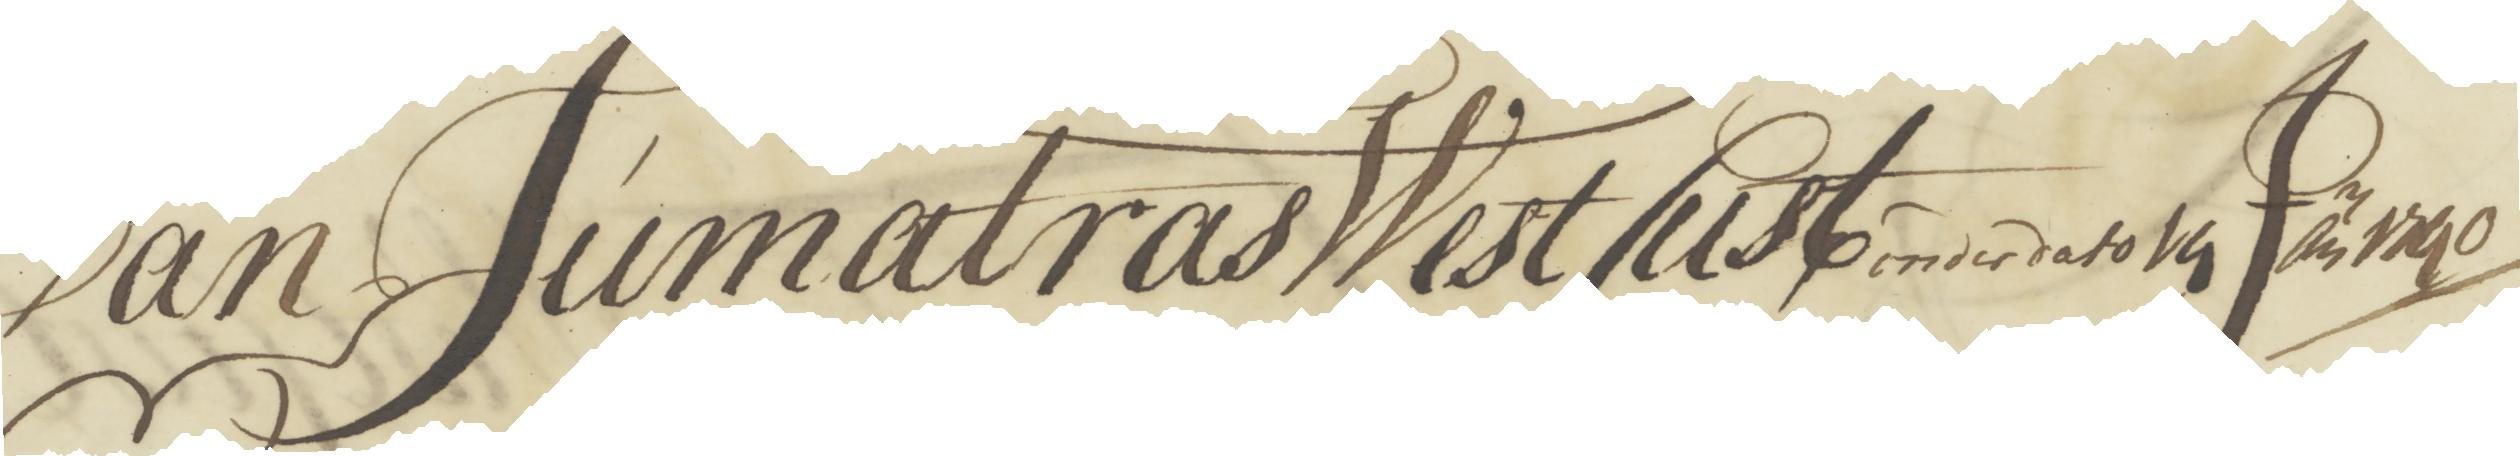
Van Sumatras West Cust onder dato 14 Jany 1740
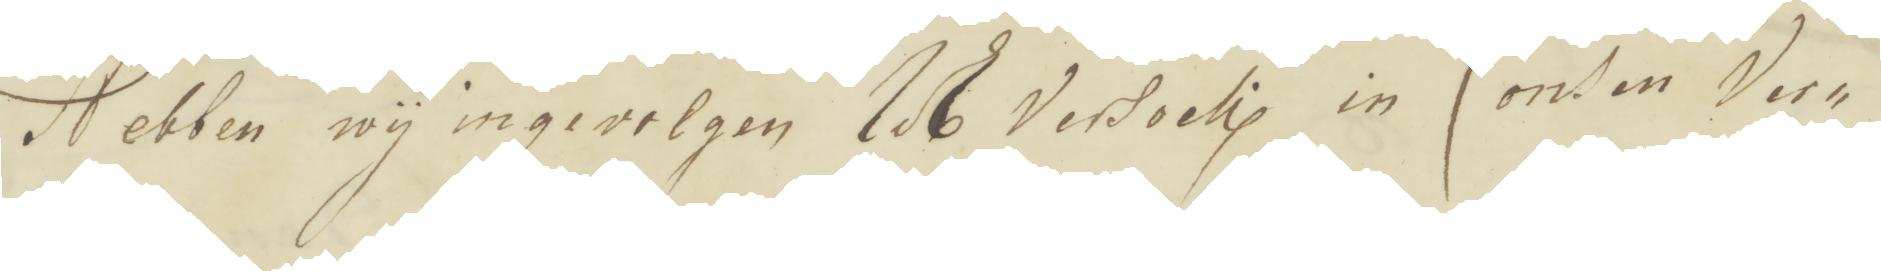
Hebben wij ingevolgen UE versoek in onsen ver„
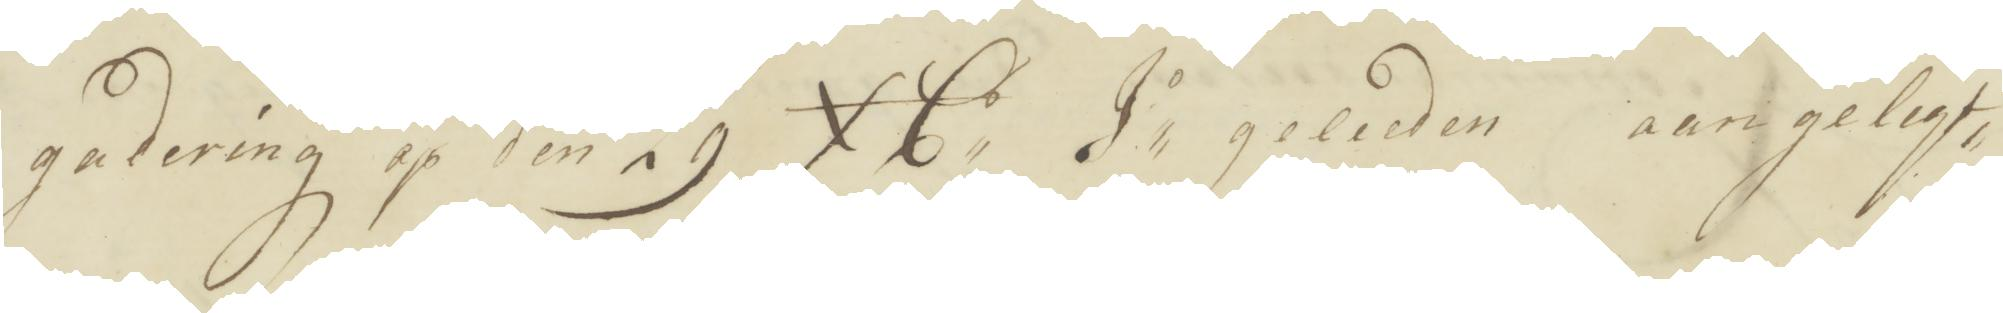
gadering op den 29 xb„s J:„o geleeden aangelegt„
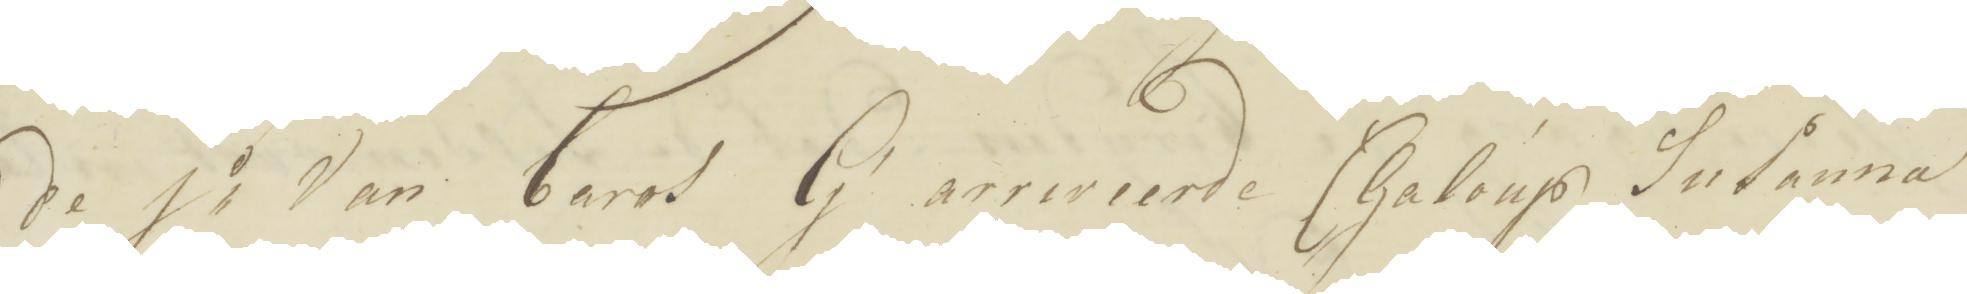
de j„o van baros G'arriveerde Chaloup Susanna
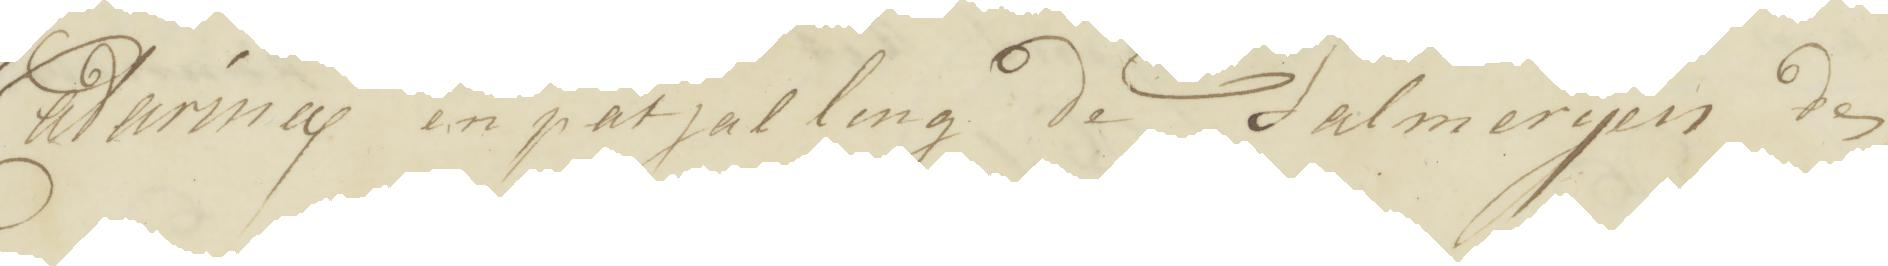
atarina en patjalling de Talmerijen den
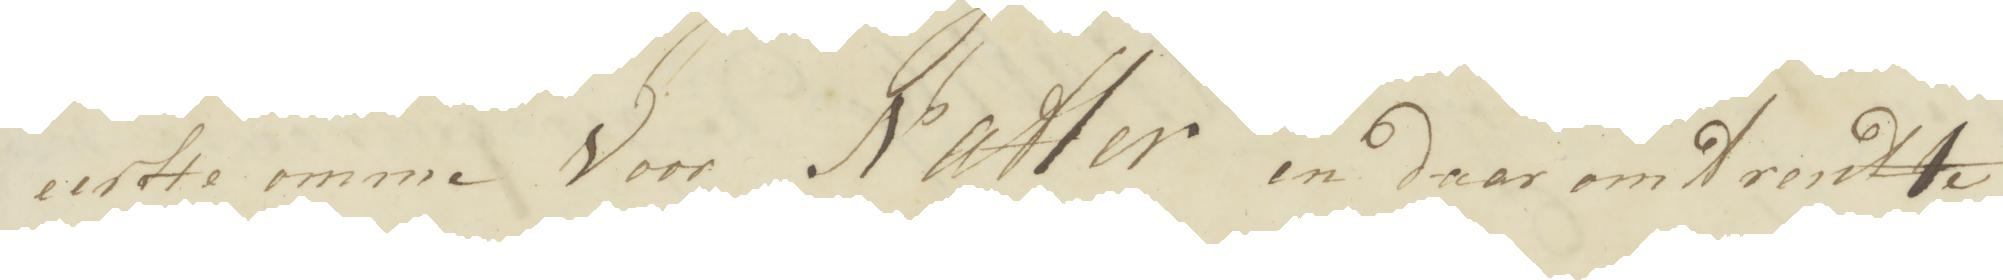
eerste omme voor Natter en daar omtrent te
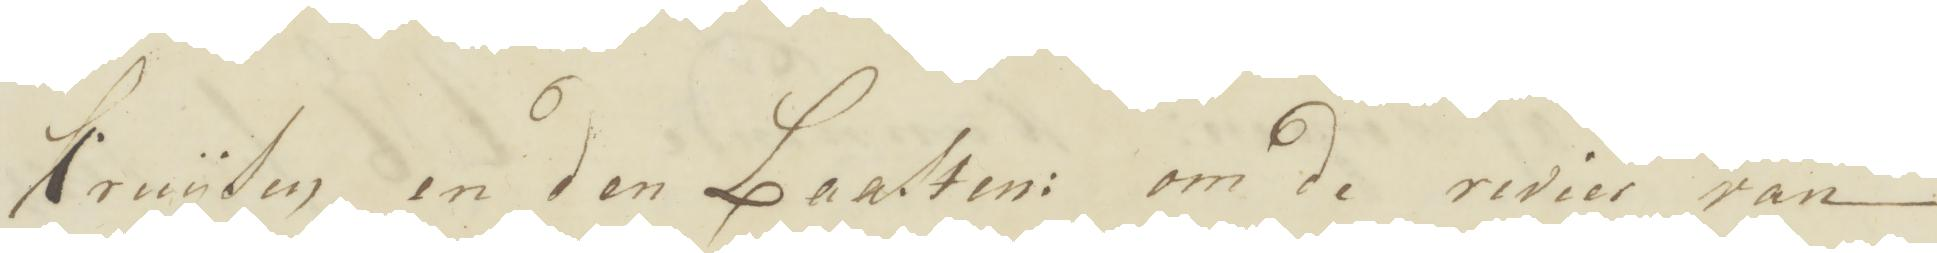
kruijsen en den Laasten: om de rivier van
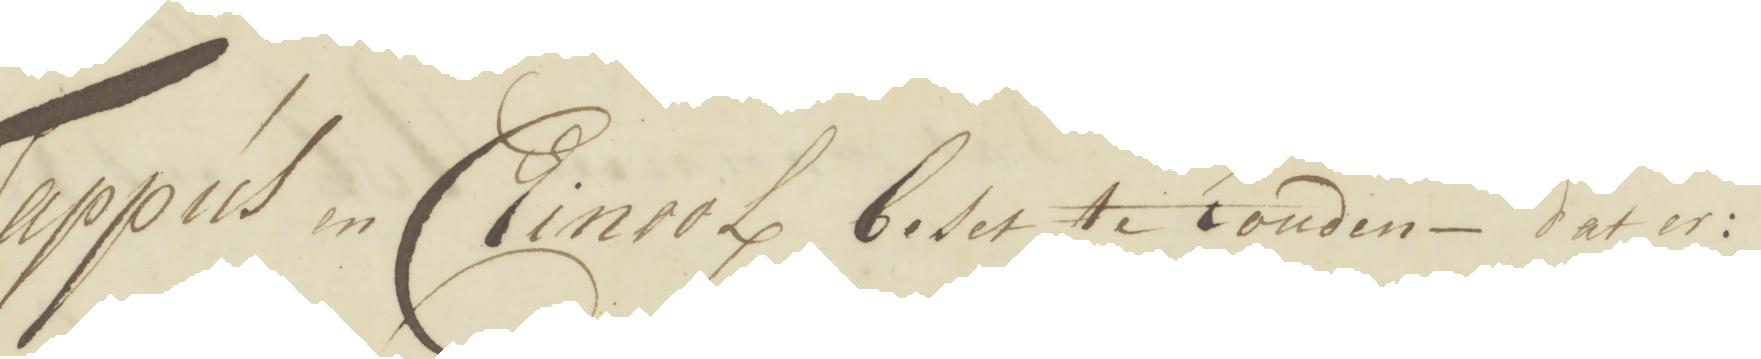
Tappus en Chinool beset te houden — dat er:
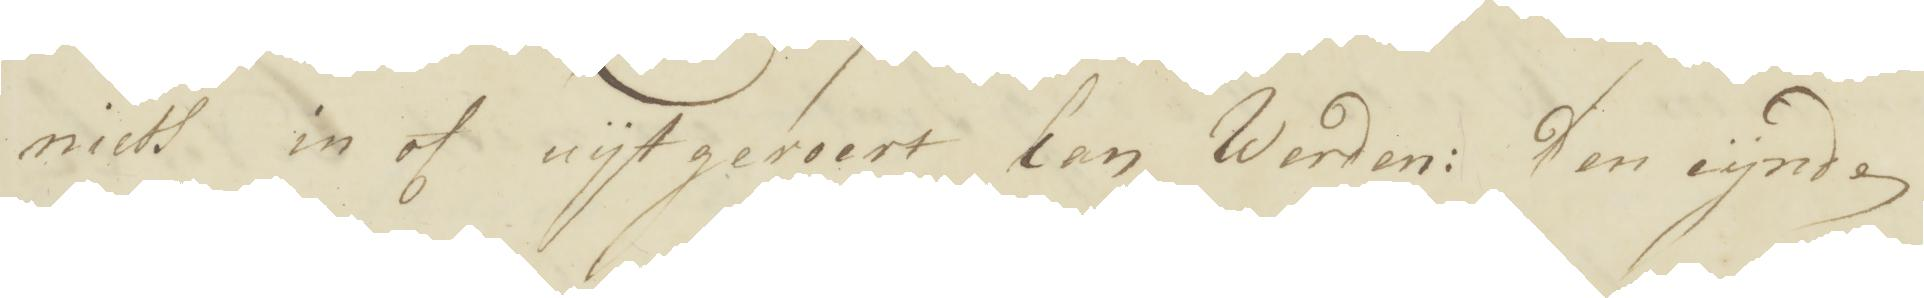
niets in of uijtgevoert kan werden: ten eijnden
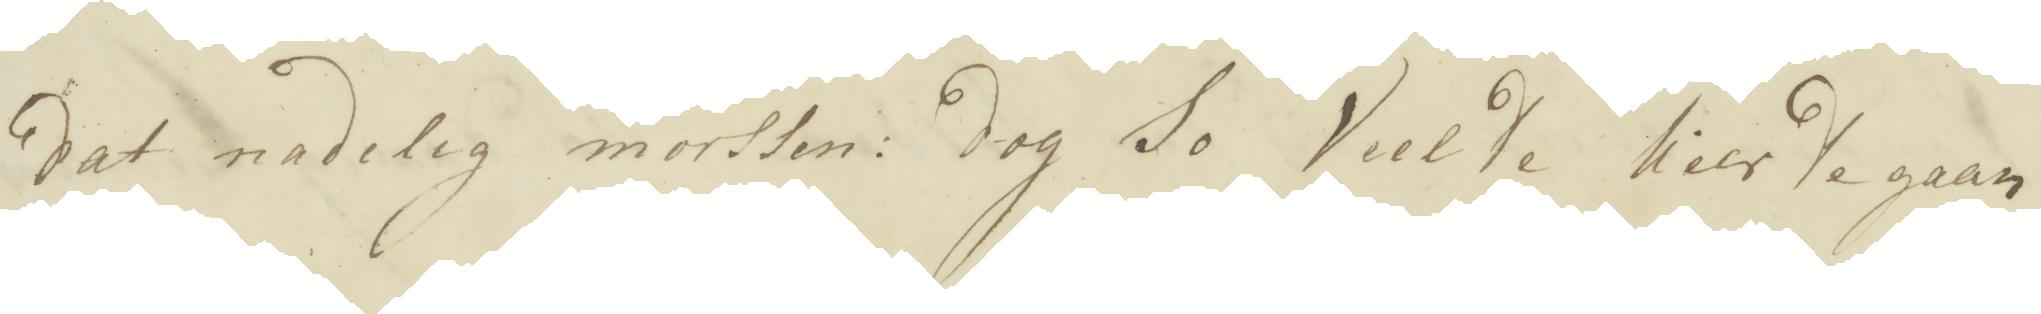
dat nadelig morssen: dog so veel te hier te gaan
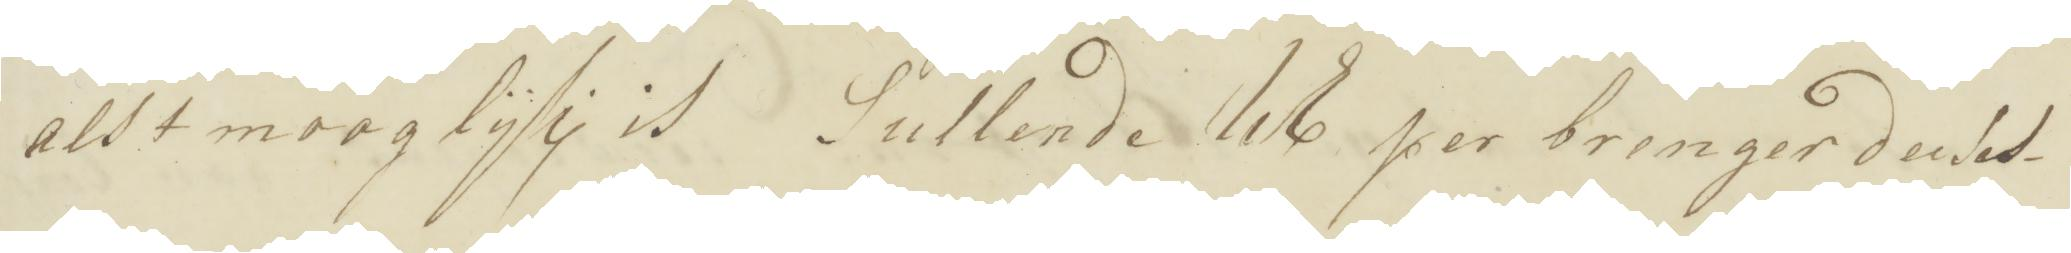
alst mooglijk is sullende UE per brenger deeses_
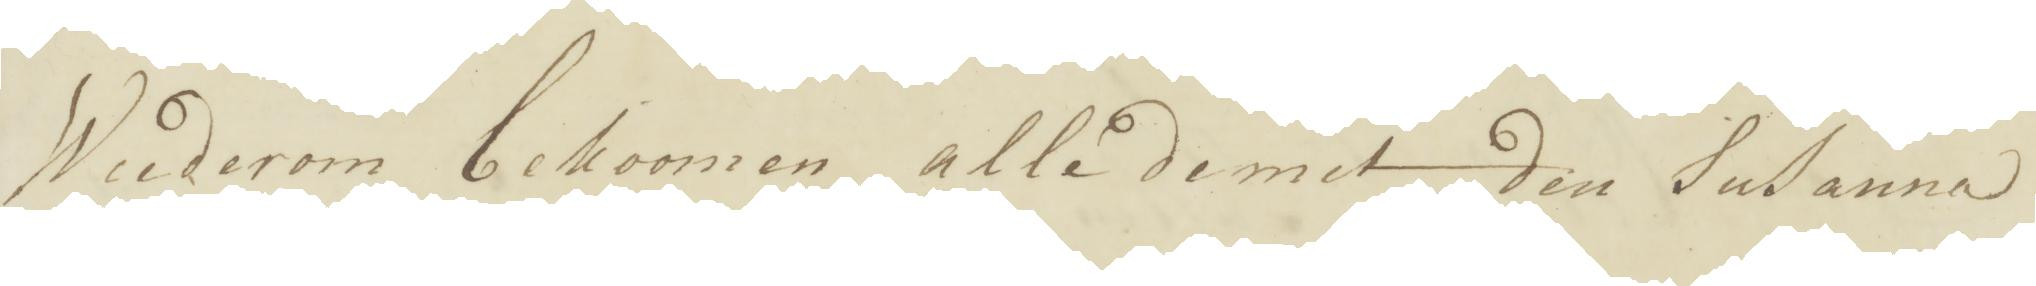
Weederom bekoomen alle de met den Susanna
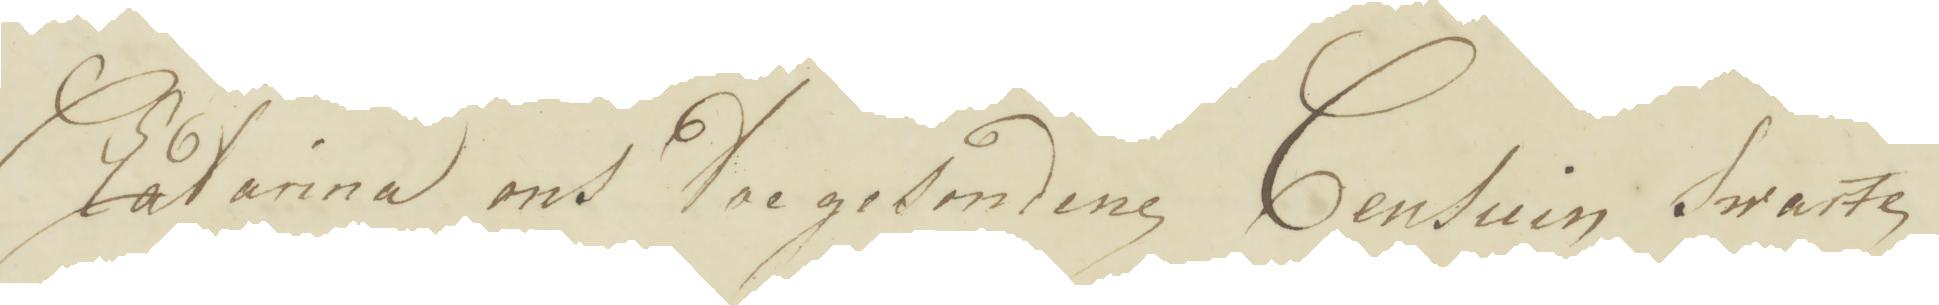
hatarina ons toegesondenen bensuin swarten
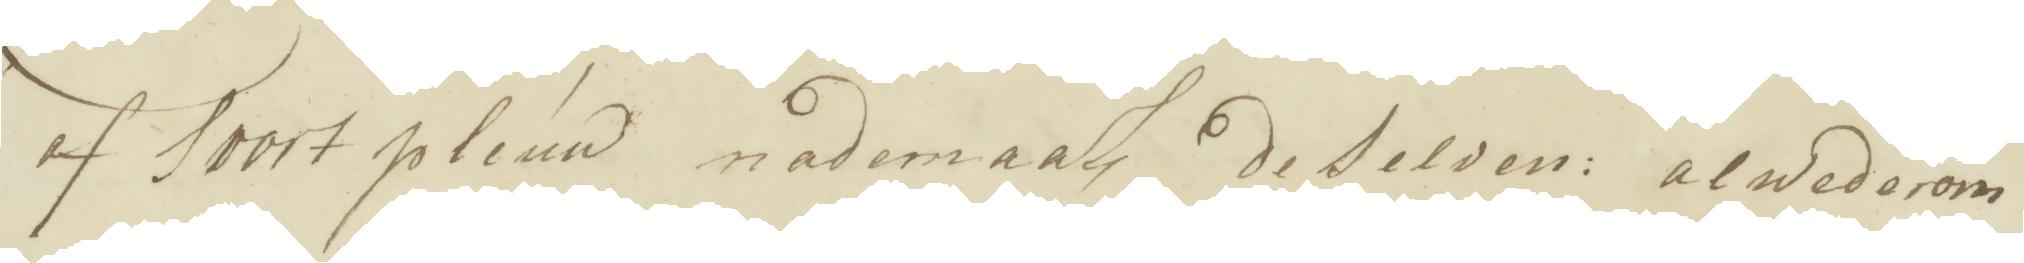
of soort pleuw nademaal de selven: al wederom
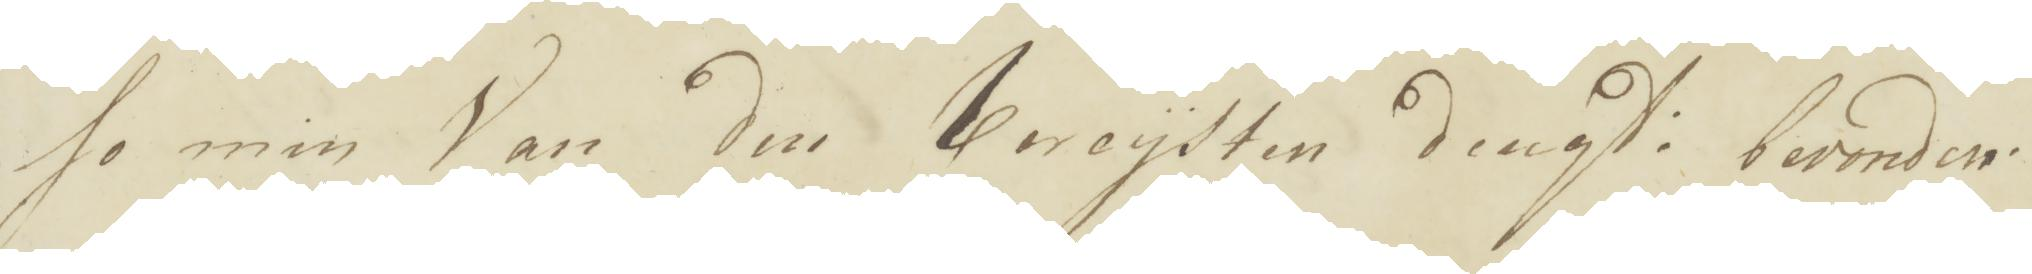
so min van den vereijsten dengt: bevonden
